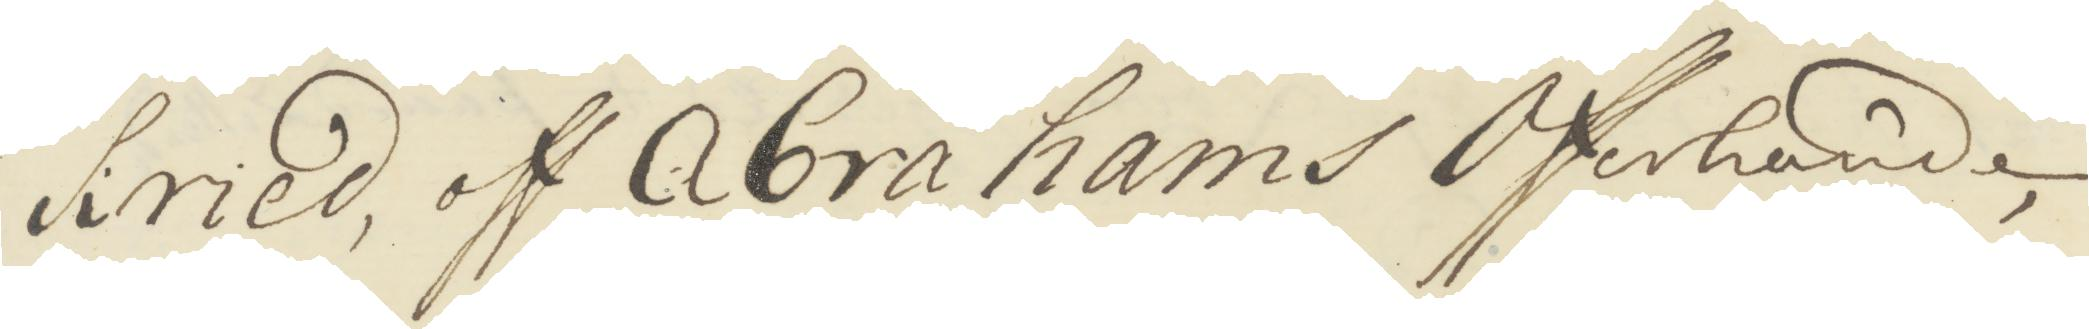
kried, off Abrahams Offerhande,
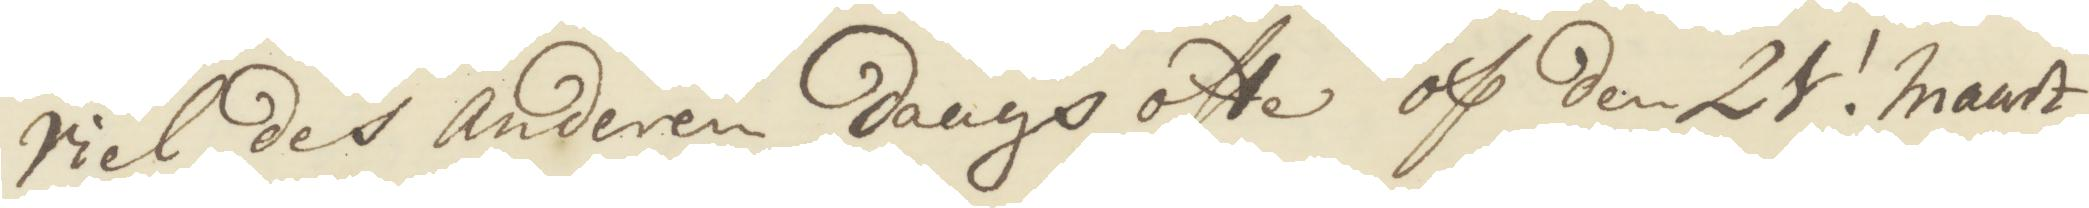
viel des anderen daags ofte op den 21! maart
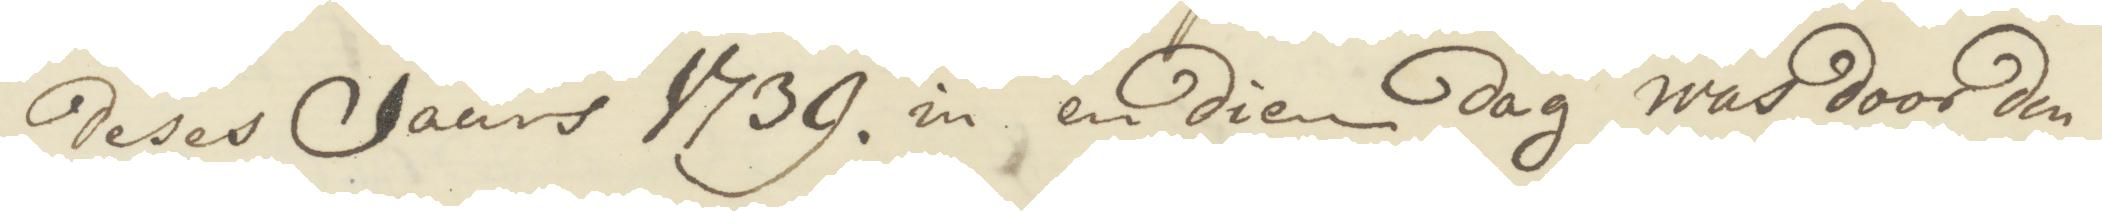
deses jaars 1739. in en dien dag was door den
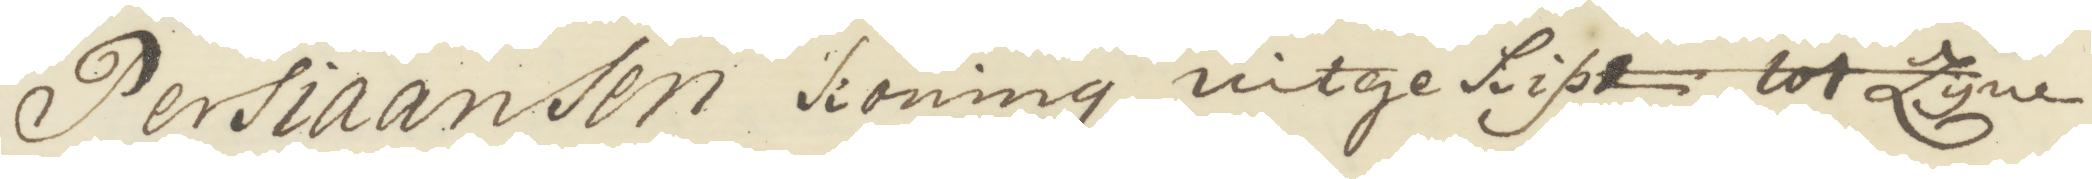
Persiaansen koning uitgekipt tot zijne
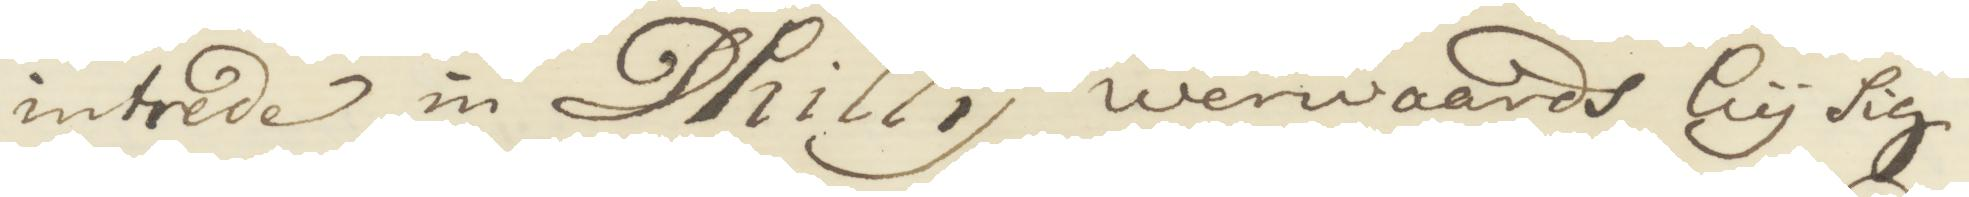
intrede in Dhillij werwaards hij sig
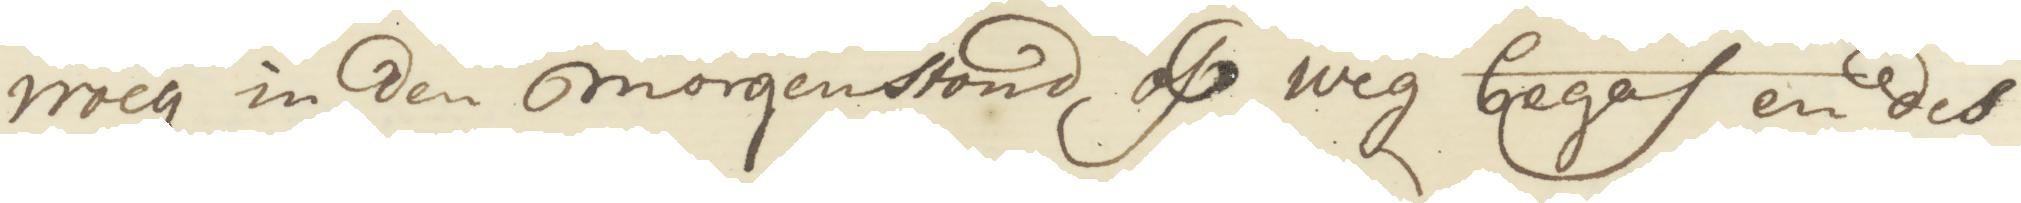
vroeg in den morgenstond op weg begaf en des
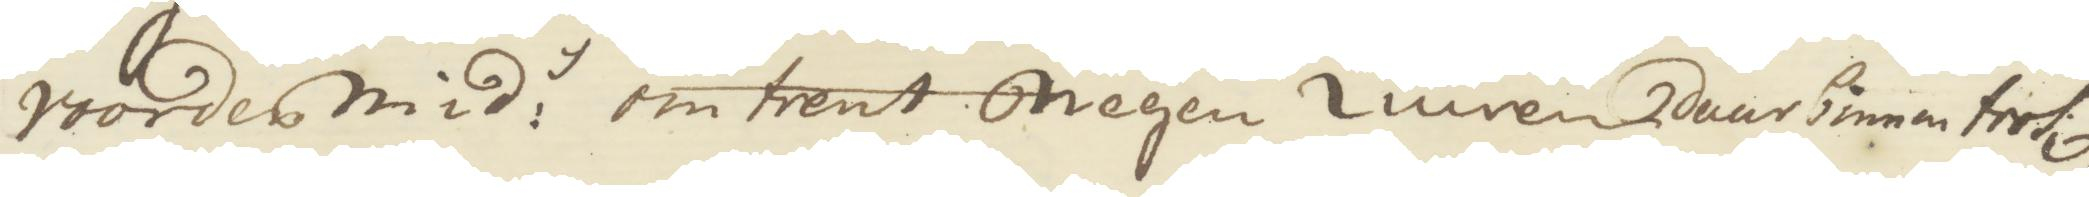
voorden mid:s omtrent negen uuren daar binnen trok
